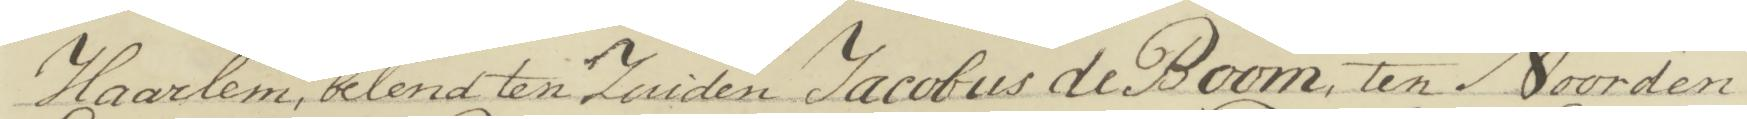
Haarlem, belend ten Zuiden Iacobus de Boom, ten Noorden
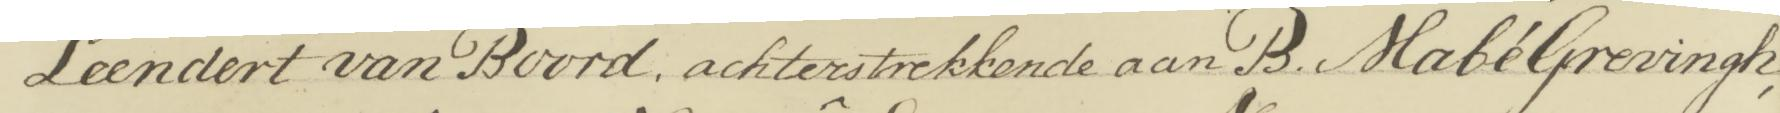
Leendert van Boord, achterstrekkende aan B. Mabé Grevingh,
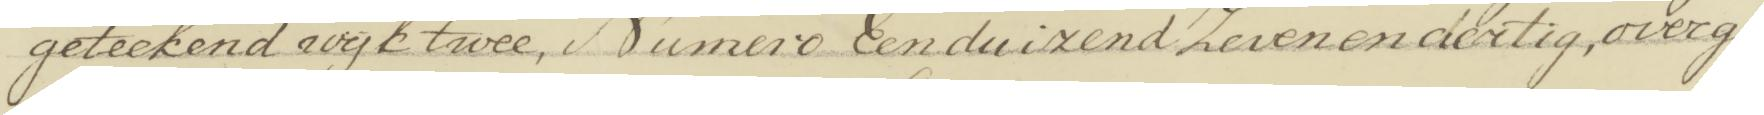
geteekend wijk twee, Numero Een duizend Zeven en dertig, overge
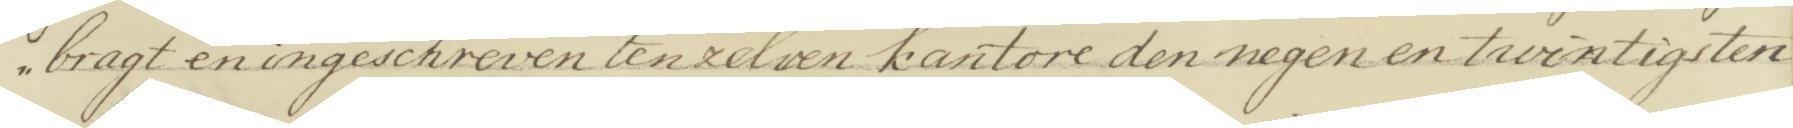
„bragt en ingeschreven ten zelven kantore den negen en twintigsten
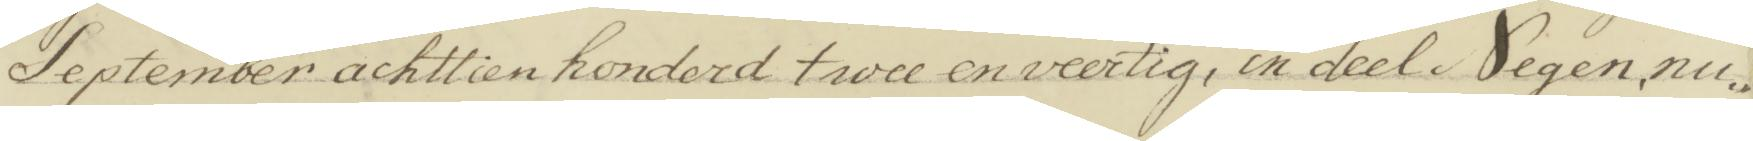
September achttien honderd twee en veertig, in deel Negen, nu„
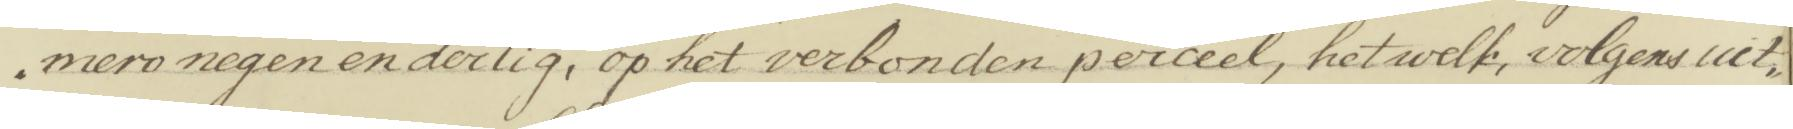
„mero negen en dertig, op het verbonden perceel, hetwelk, volgens uit„
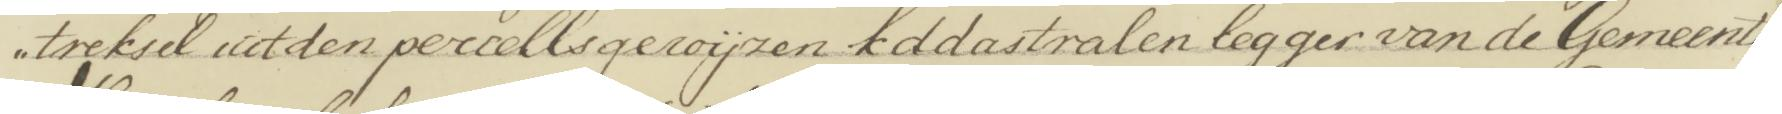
„treksel uit den percells gewijzen kadastralen legger van de Gemeente
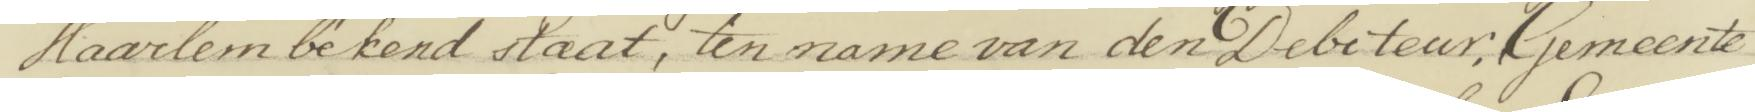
Haarlem bekend staat, ten name van den Debiteur, Gemeente
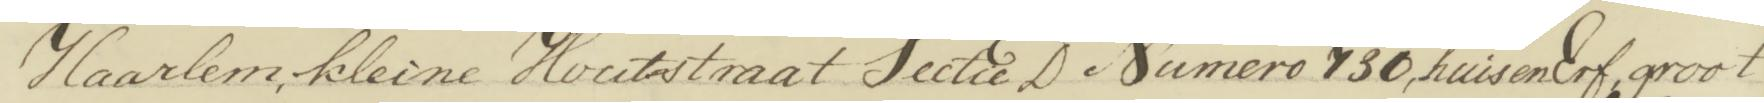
Haarlem, kleine Houtstraat Sectie D Numero 730, huis en Erf, groot
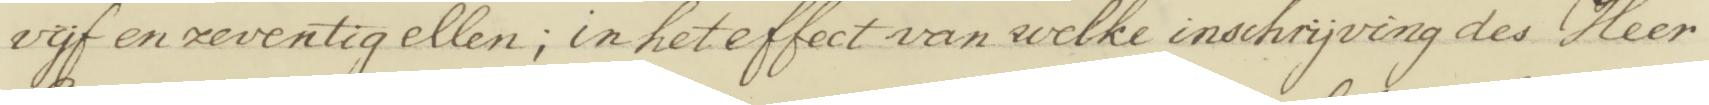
vijf en zeventig ellen; in het effect van welke inschrijving des Heer
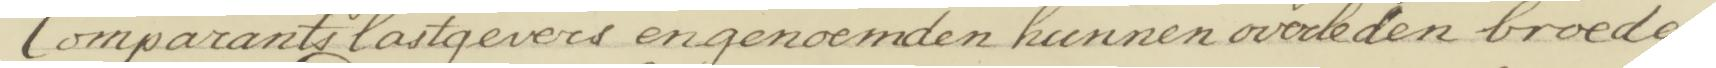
Comparants lastgevers en genoemden hunnen overleden broeder
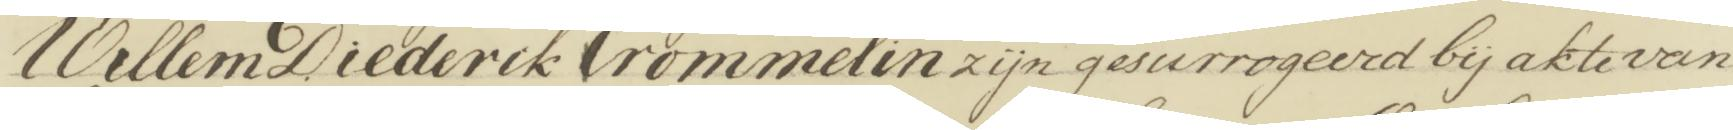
Willem Diederik Crommelin zijn gesurrogeerd bij akte van
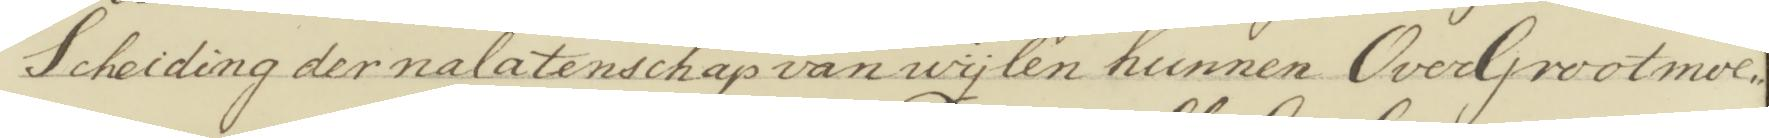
Scheiding der nalatenschap van wijlen hunnen OverGrootmoe„
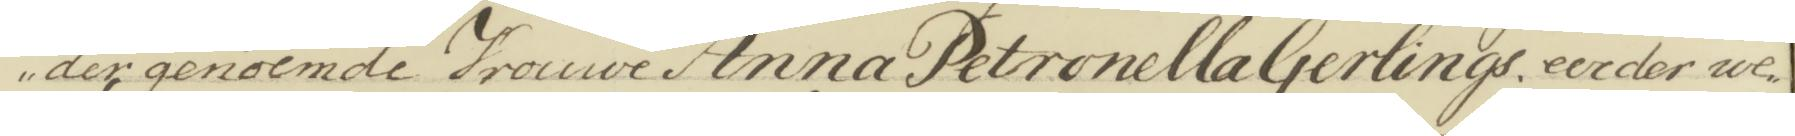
„der, genoemde Vrouwe Anna Petronella Gerlings, eerder we„
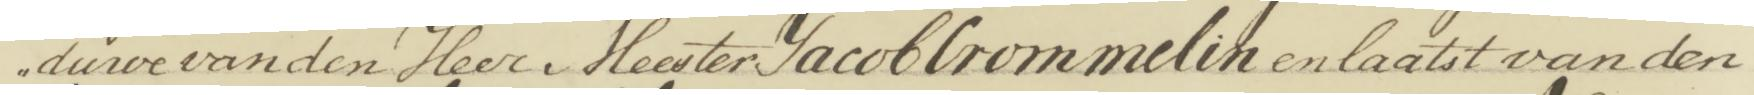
„duwe van den Heer Meester Iacob Crommelin en laatst van den
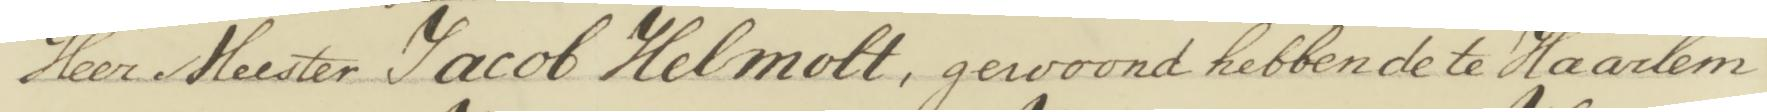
Heer Meester Iacob Helmolt, gewoond hebbende te Haarlem
